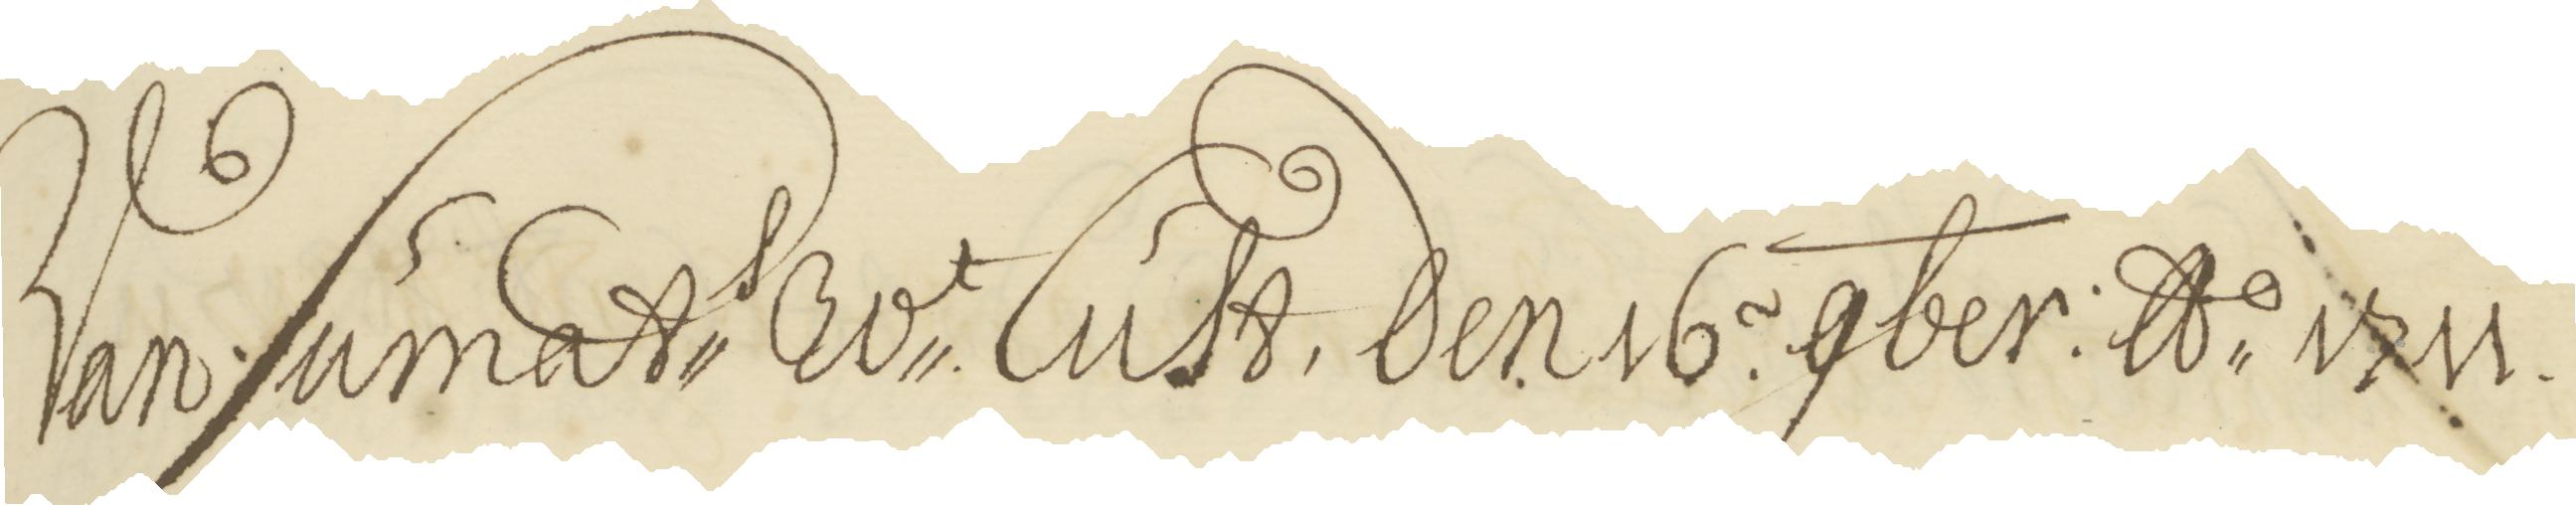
Van Sumat„s W„t Cust: den 16.e 9ber: A„o 1711.
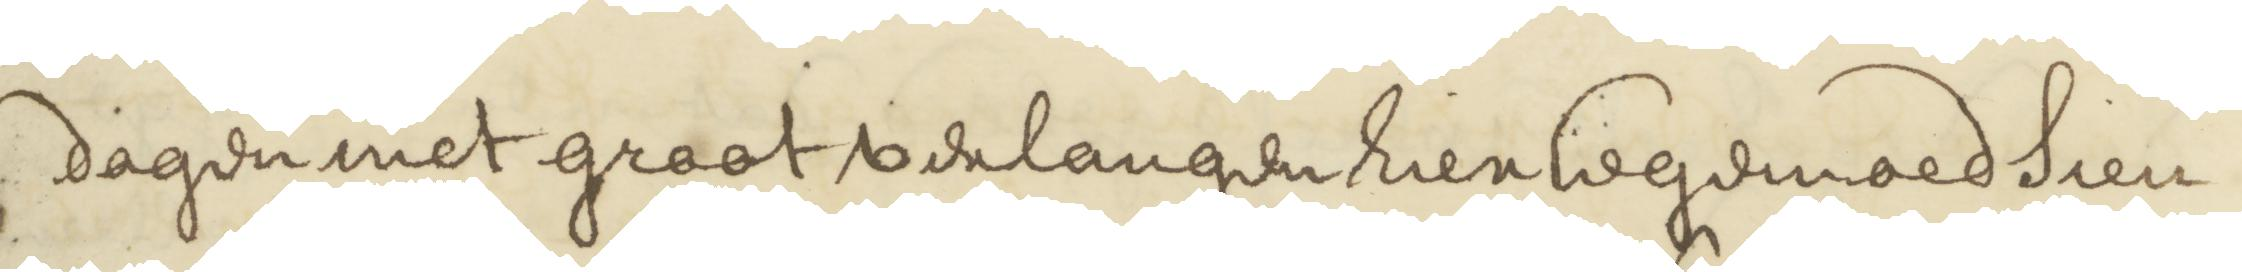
dagen met groot verlangen hier tegemoed sien
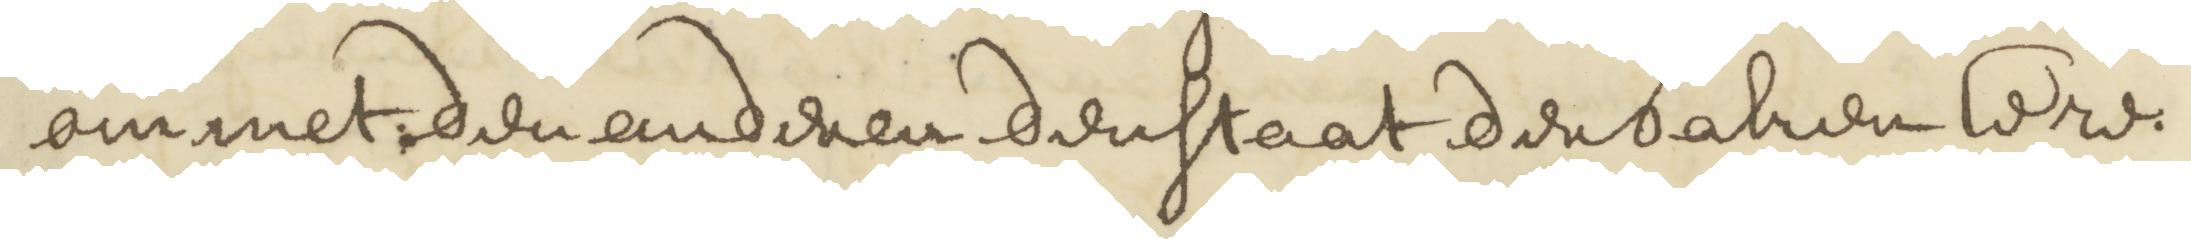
om met den anderen denstaat dersaken te re.
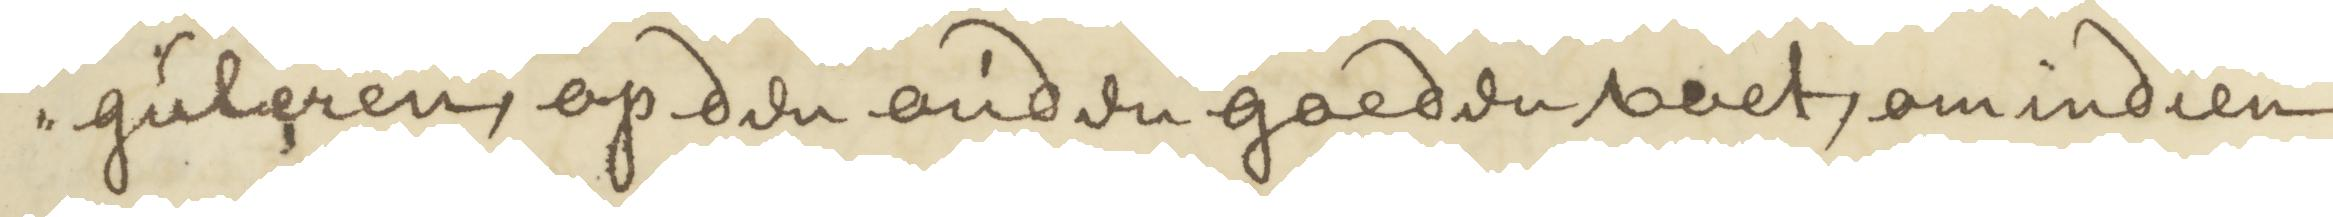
„guleren, op den ouden goeden voet, om indien
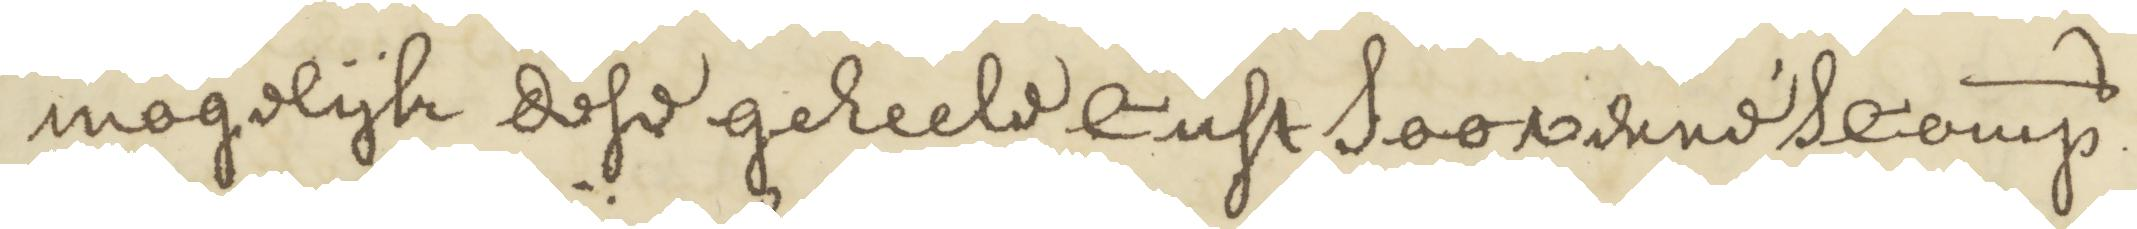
mogelijk dese geheele Cust Soo verre ’S comp:s
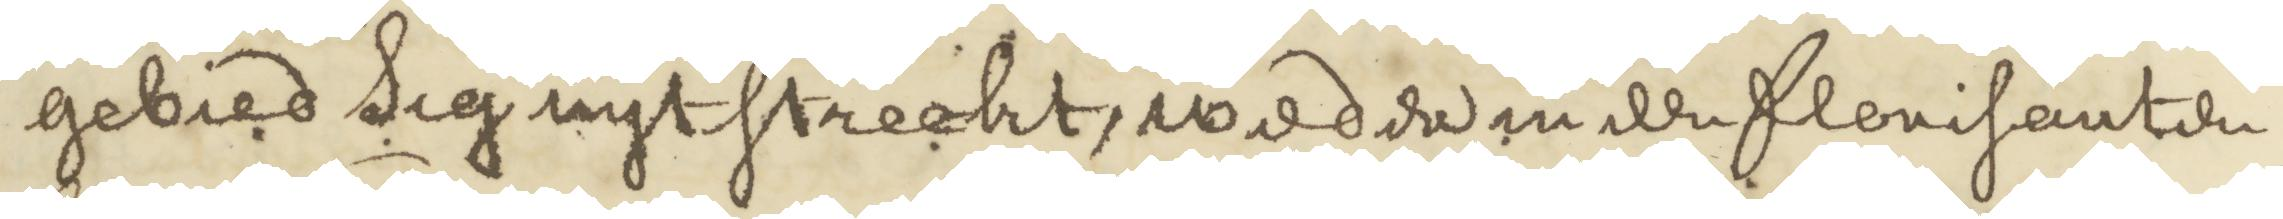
gebied Sig uyt streckt, weder in een florisanten
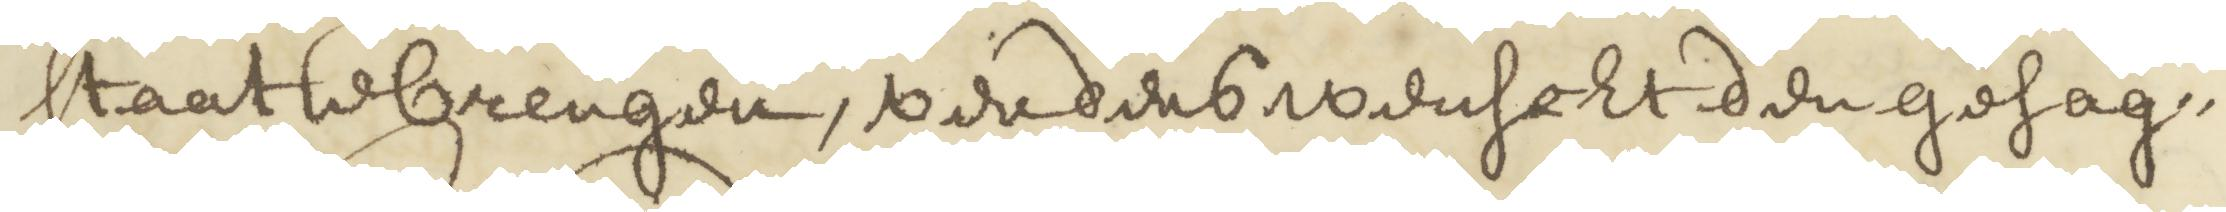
staat te brengen, verders wenscht den gesag„
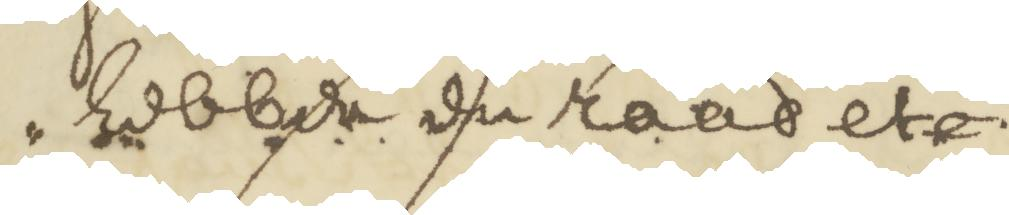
„hebber en raad etc:
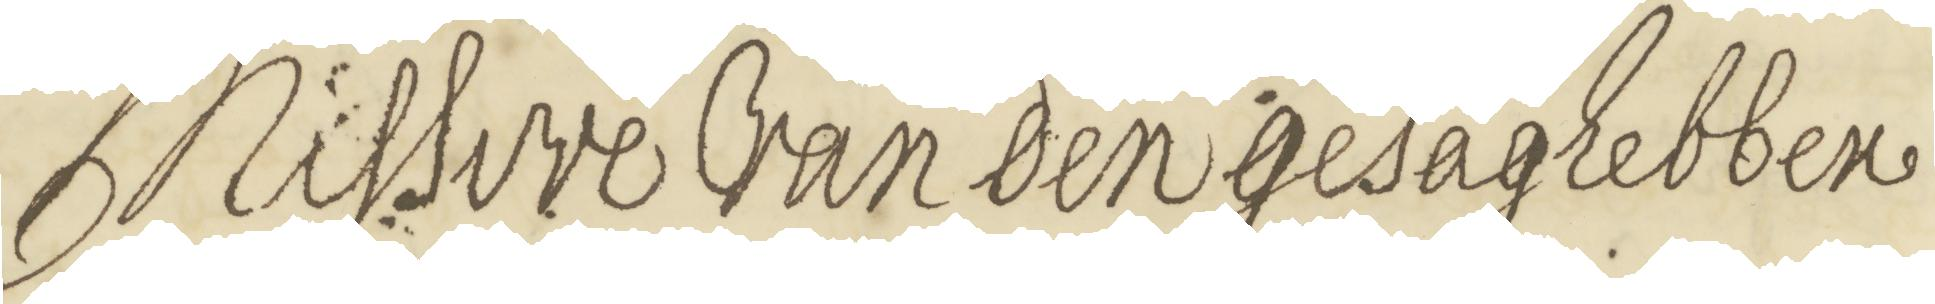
Missive van den gesaghebber
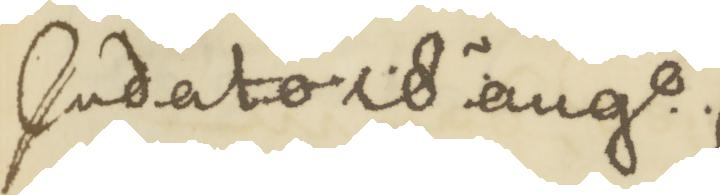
Indato 18:e aug.s.
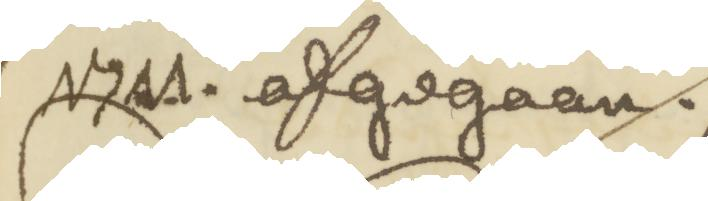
1711. afgegaan.
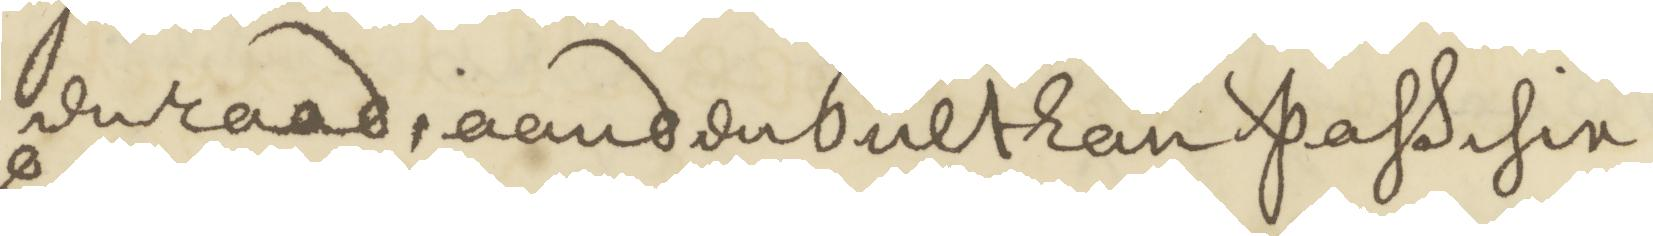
en raad , aandensulthan passisir
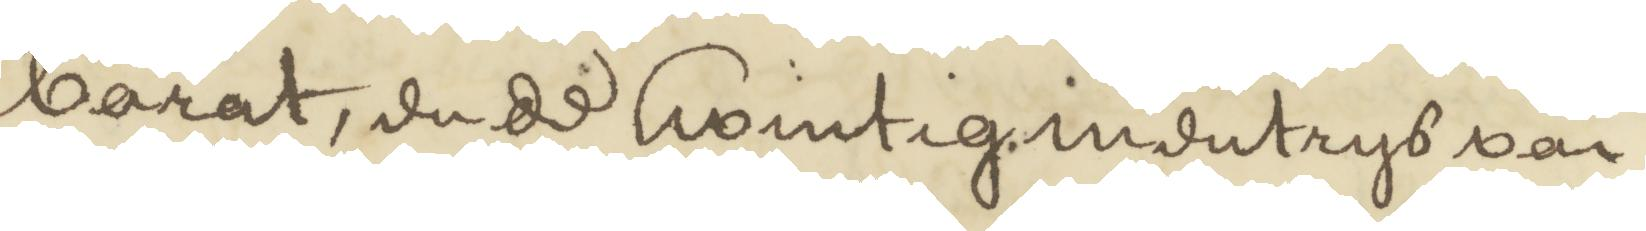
barat, en de twintig. inentrys van
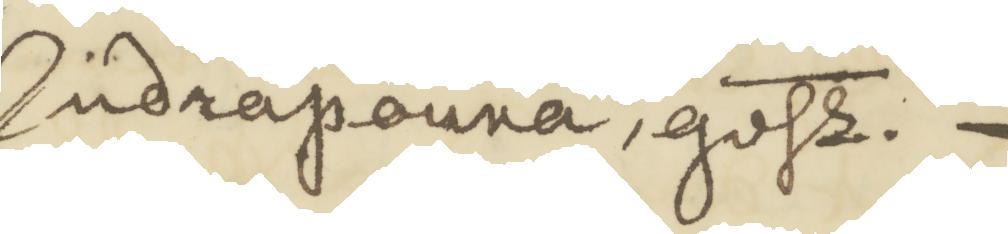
Indrapoura, gesz. —
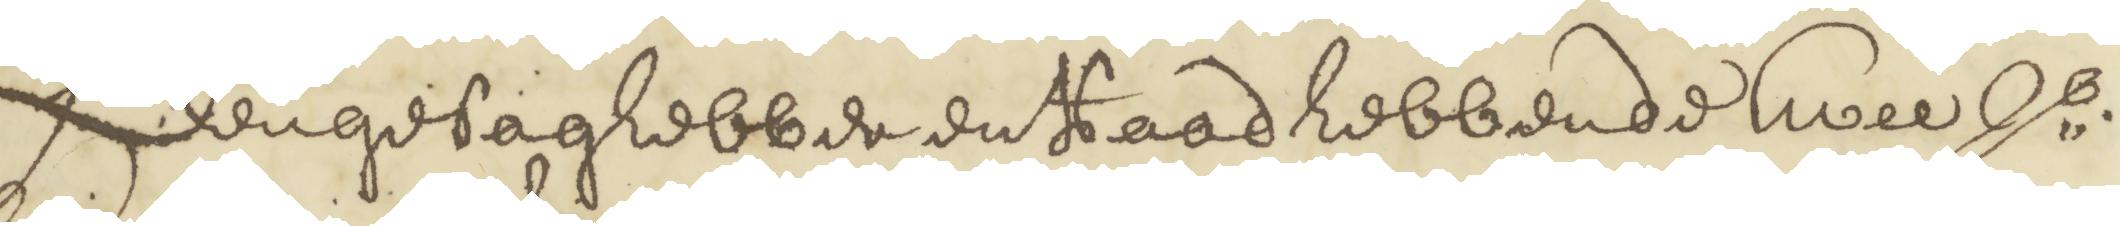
Den gesaghebber en Raad hebbende twee I„s
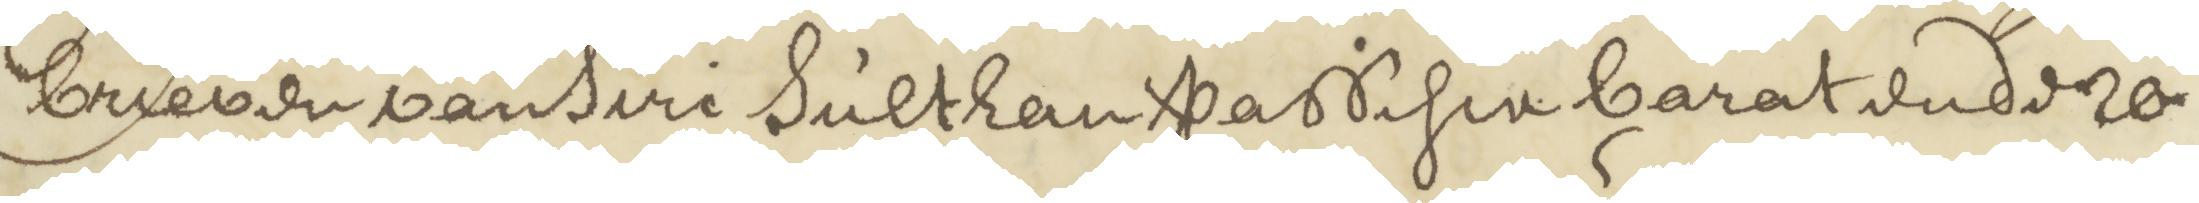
brieven van Siri Sulthan passisir barat ende 20
